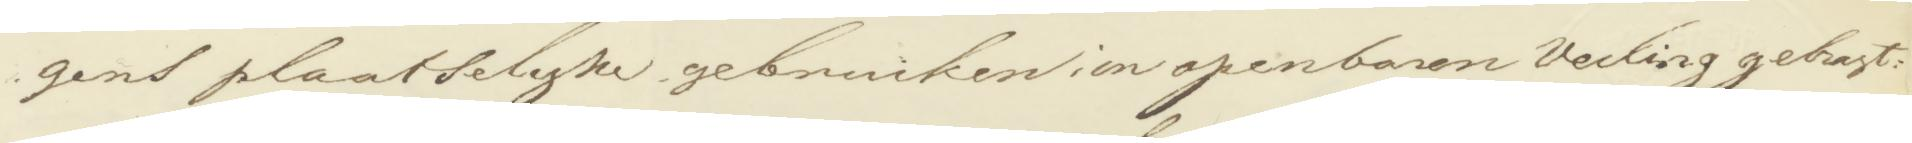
„gens plaatselyke gebruiken; in openbaren veiling gebragt:
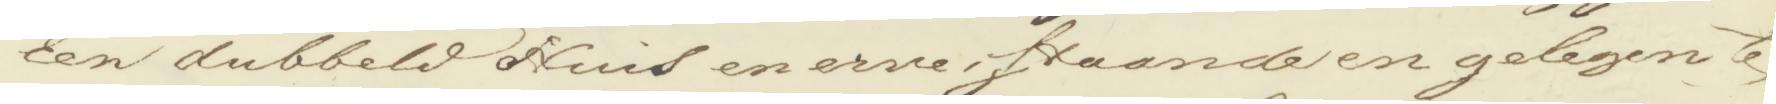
Een dubbeld Huis en erve,staande en gelegen te
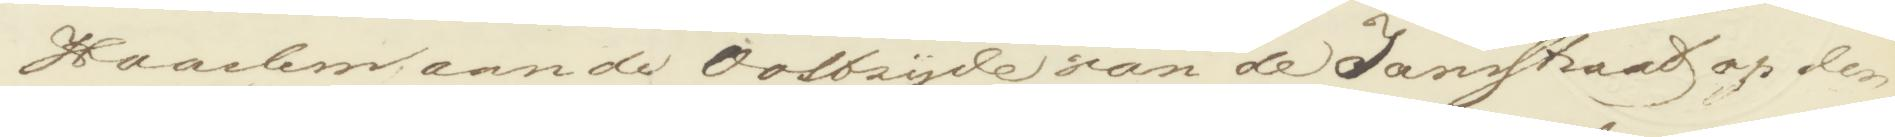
Haarlem aan de Oostzijde van de Jansstraat op den
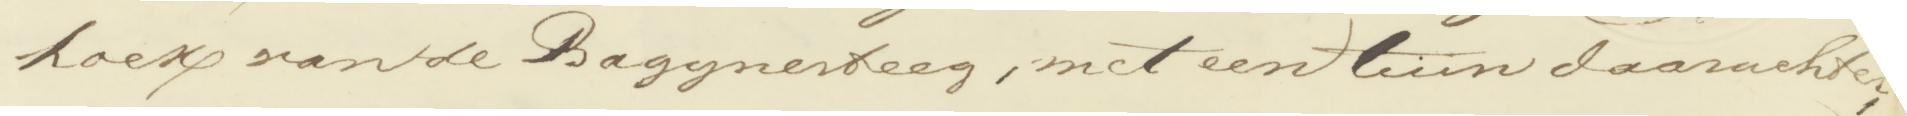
hoek van de Bagynesteeg, met een tuin daarachter,
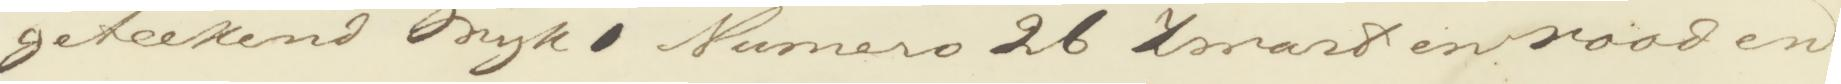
geteekend Wyk 1 Numero 26 zwart en rood en
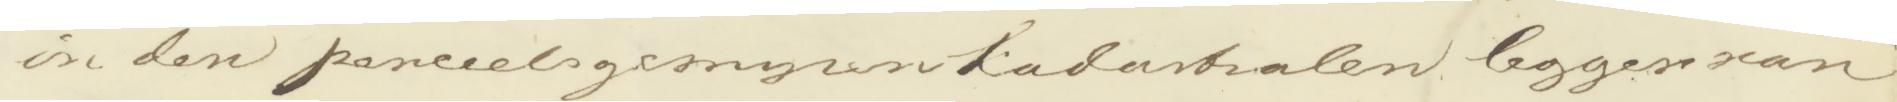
in den penceels gewyzen kadastralen legger van
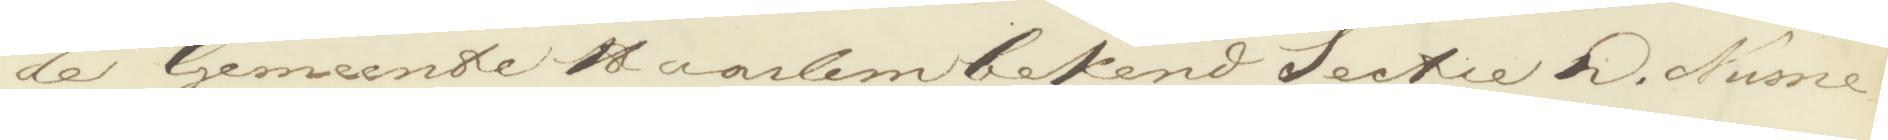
de Gemeende Haarlem bekend Sectie D. Nume
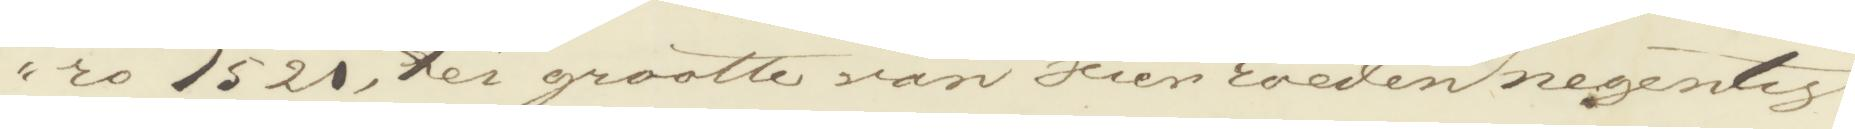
„ro 1521, ter grootte van vier roeden negentig
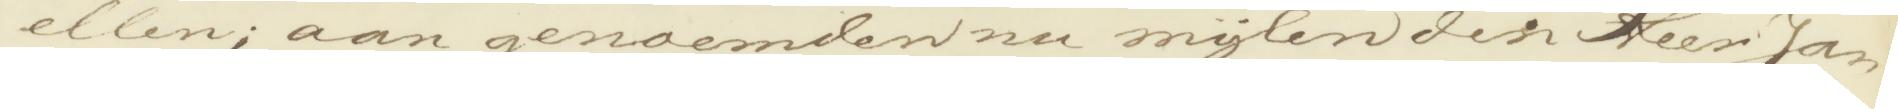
ellen; aan genoemden nu wijlen den Heer Jan
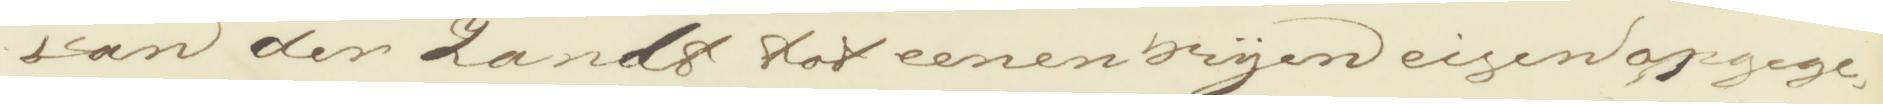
van der Zandt tot eenen vrijen eigen opgege,
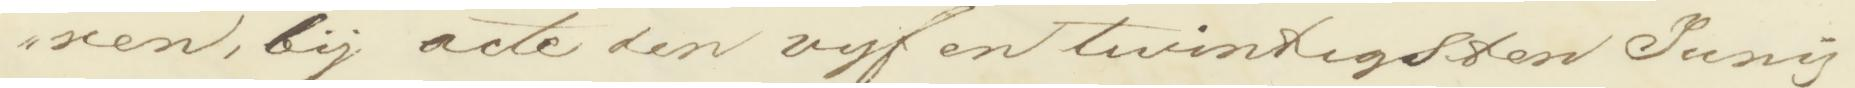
„ven, bij acte ten vyf en twintigsten Junij
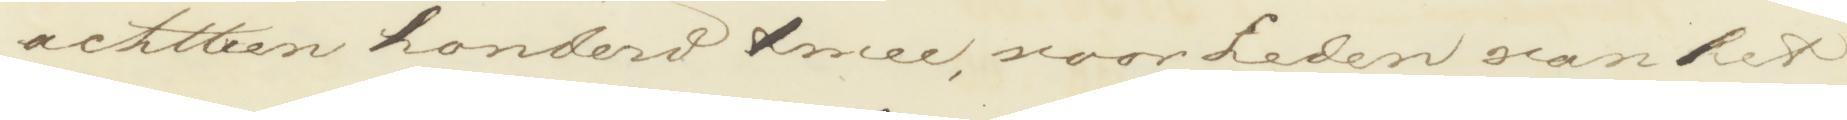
achttien honderd twee, voor Leden van het
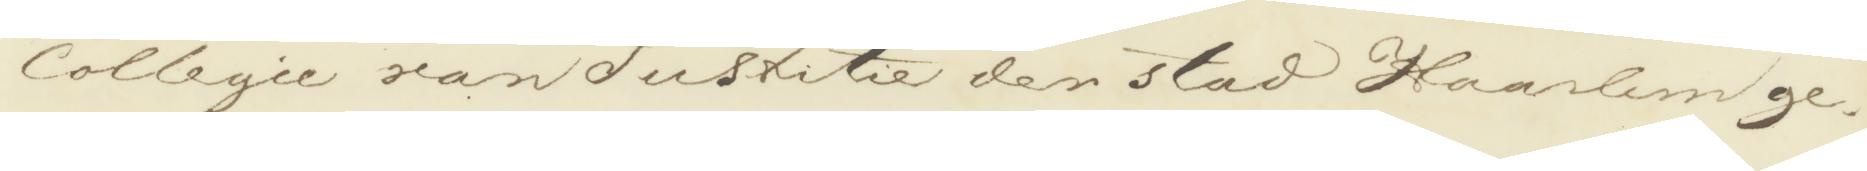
collegie van Justitie der stad Haarlem ge.
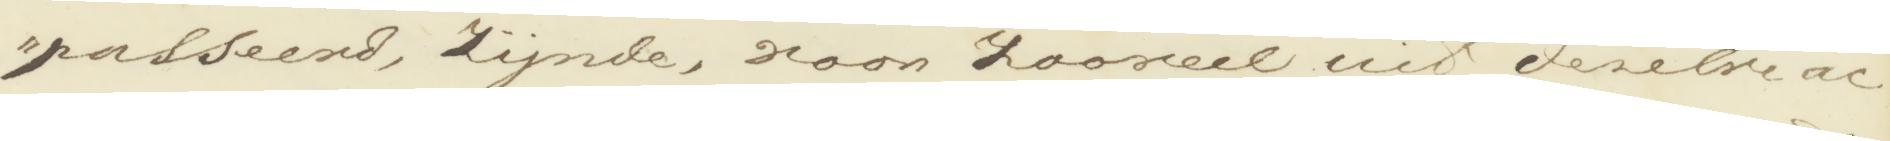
„passeerd, zijnde, voor zooveel uit dezelve ac
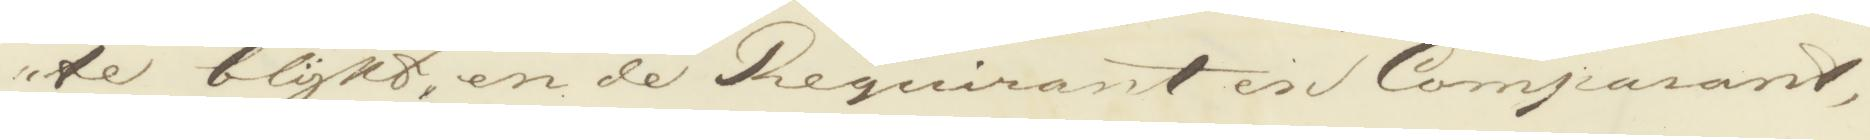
„te blijkt, en de Requirant en Comparant,
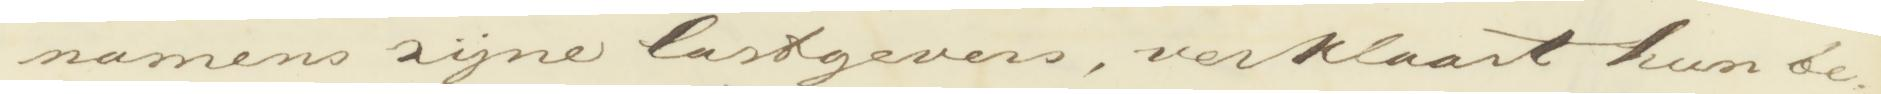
namens zijne lastgevers, verklaart hun be.
